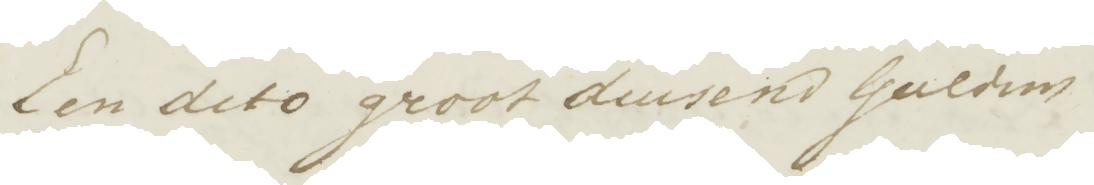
Een dito groot duisend Guldens
